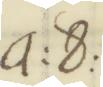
4:8
